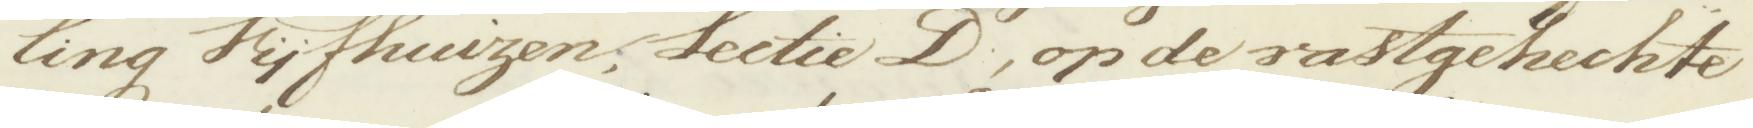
ling Vijfhuizen, sectie D:, op de vastgehechte
